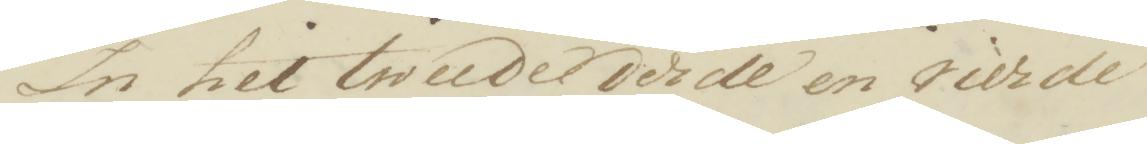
Jn het tweede, derde en vierde
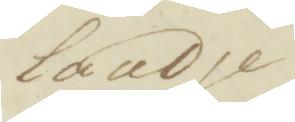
laadje.
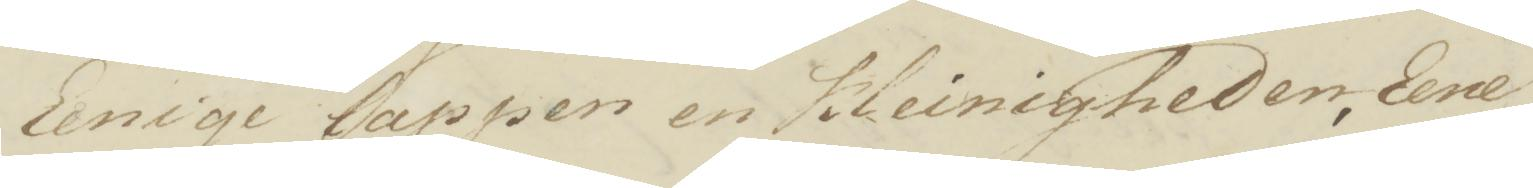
Eenige lappen en kleinigheden, Eene
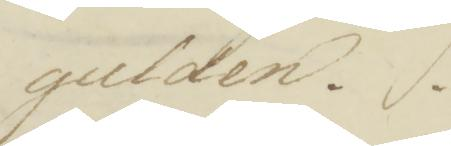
gulden . . . . . . . . . . „ 1 „
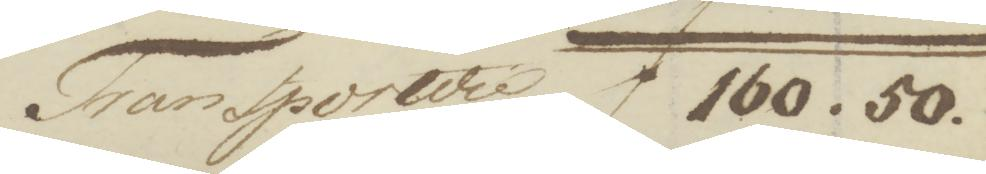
Transportere „ ƒ 160. 50.
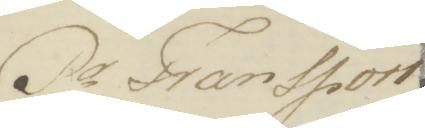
Pr Transport ƒ 160. 50.
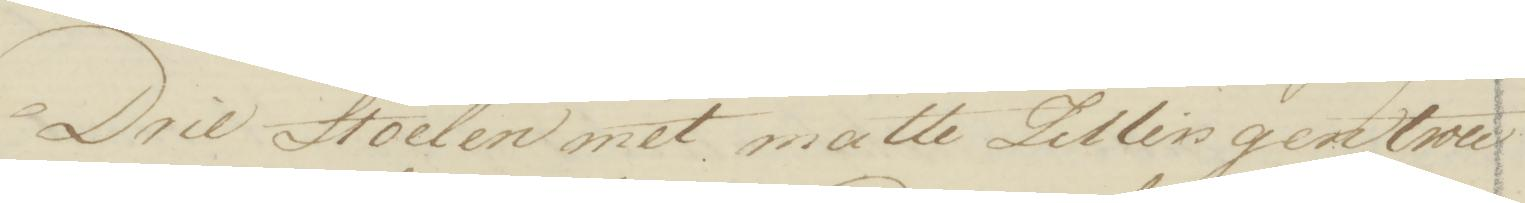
Drie stoelen met matte zittingen, twee
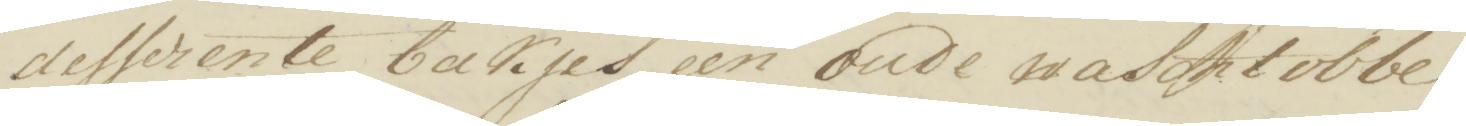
differente bakjes, een oude waschtobbe,
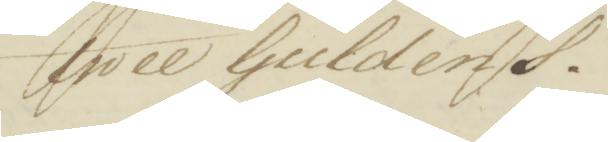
twee Guldens . . . . . . . . . . „ 2 „
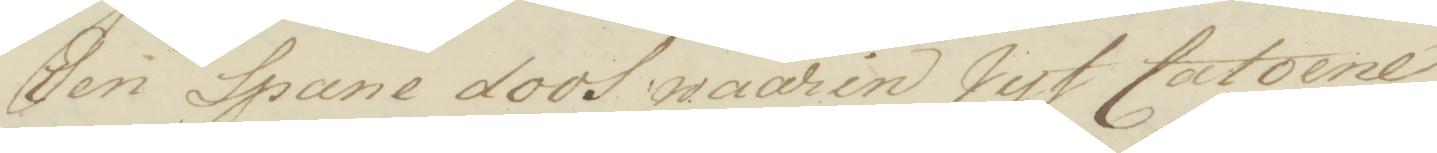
Een Spane doos, waarin vyf Catoene
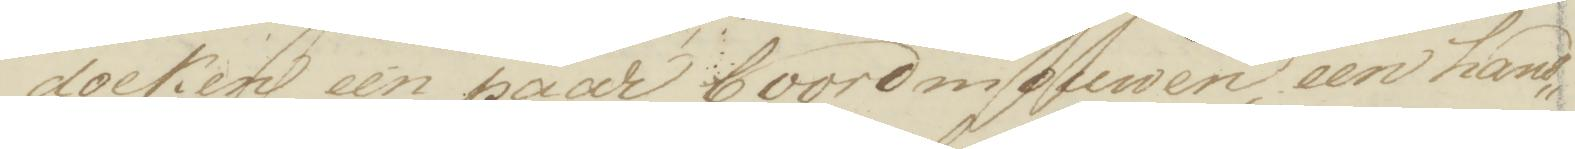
doeken, een paar boordmouwen, een hand„
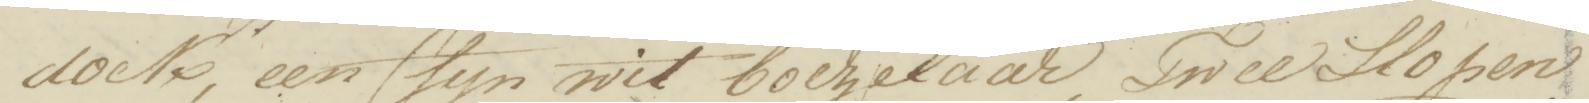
doek, een fyn wit boezelaar, Twee slopen,
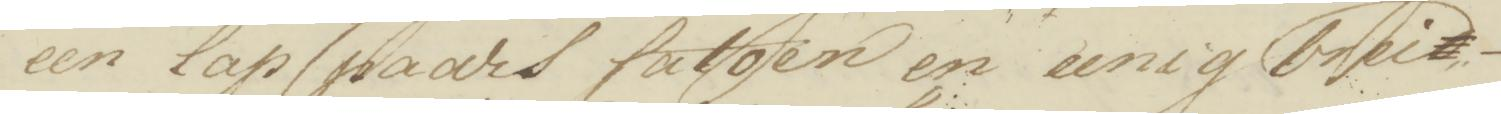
een lap paars Catoen en eenig breid„
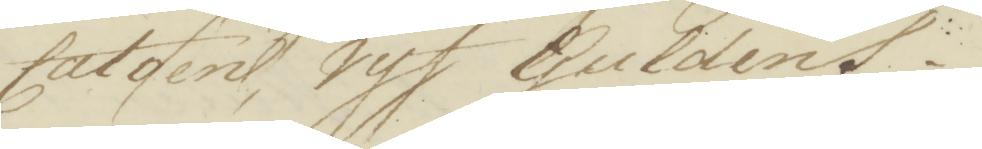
Catoen, vyf Guldens . . . . . . „ 5 „
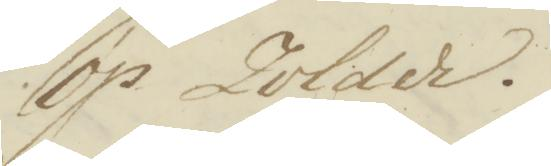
Op Zolder.
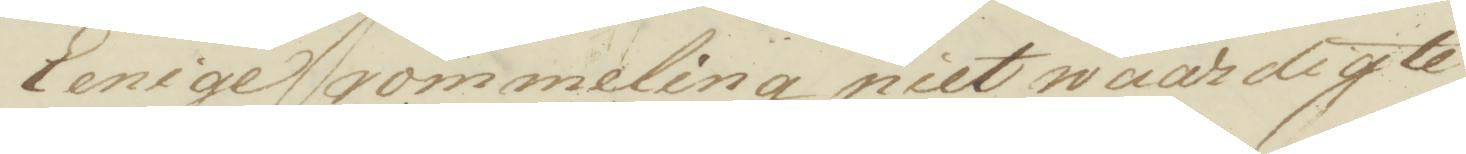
Eenige rommeling niet waardig te
